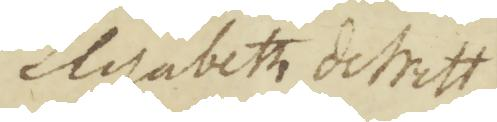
Elisabeth de Witt
